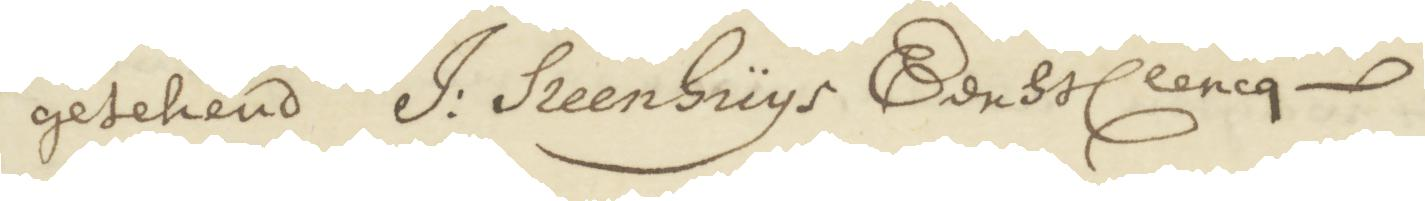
getekend I: steenhuijs Eerst Clercq —
